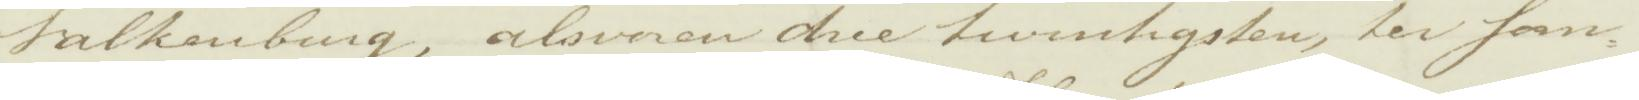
Valkenburg, alsvoren drie twintigsten, ter som„
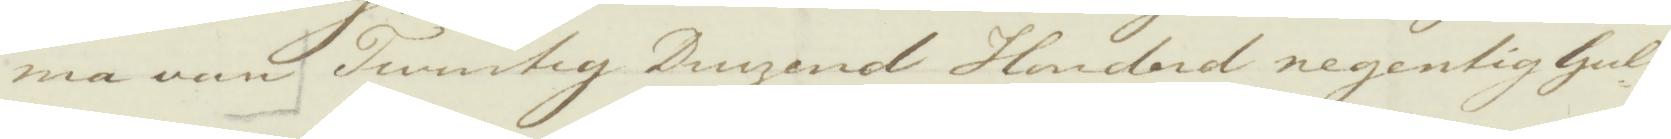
ma van Twintig Duizend Honderd negentig Gul
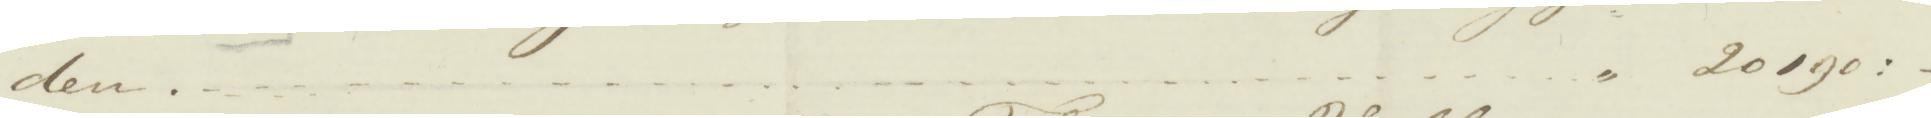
den . . . . . . . . . . . . . . . . . . . . . . . . . . . . . „ 20190 :
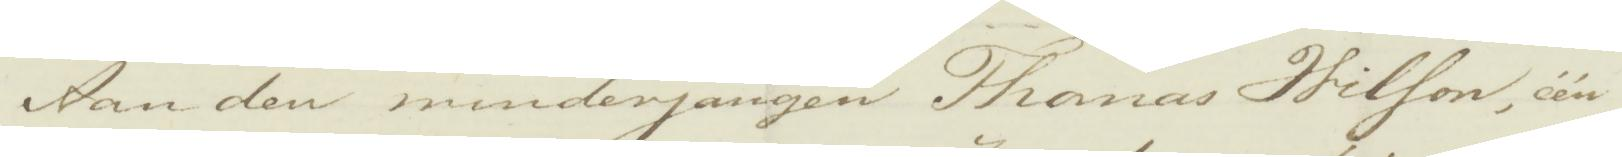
Aan den minderjarigen Thomas Wilson, één
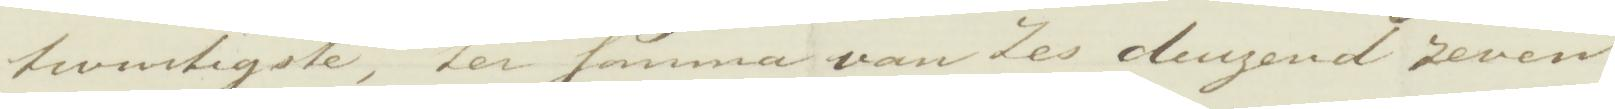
twintigste, ter somma van Zes duizend zeven
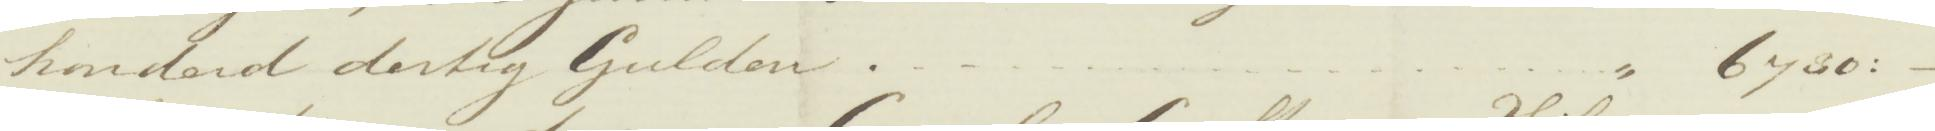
honderd dertig Gulden . . . . . . . . . . . . . . . . . „ 6730: -
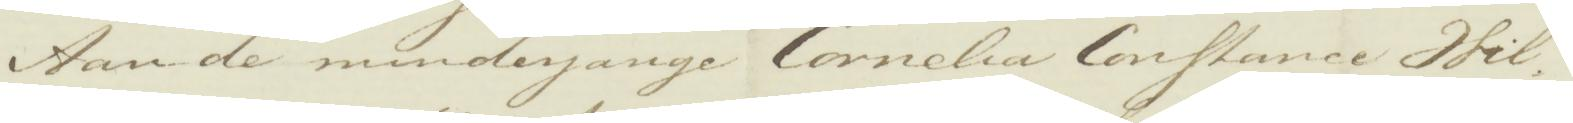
Aan de minderjarige Cornelia Constance Wil„
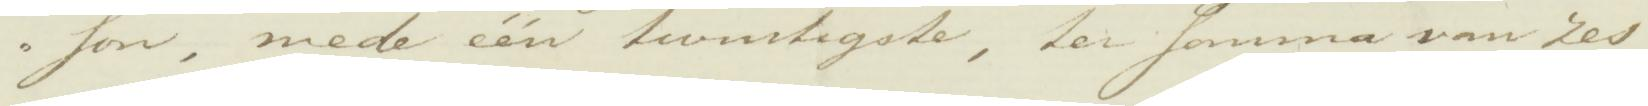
„son, mede één twintigste, ter somma van zes
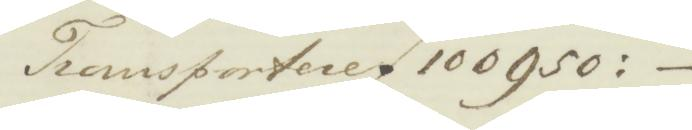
Transportere ƒ 100950 : —
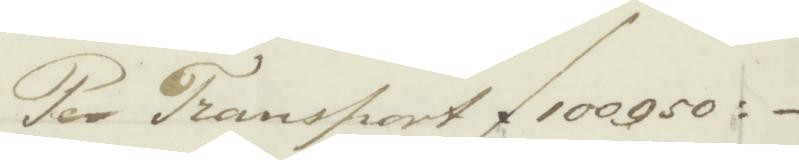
Per Transport ƒ 100950 : —
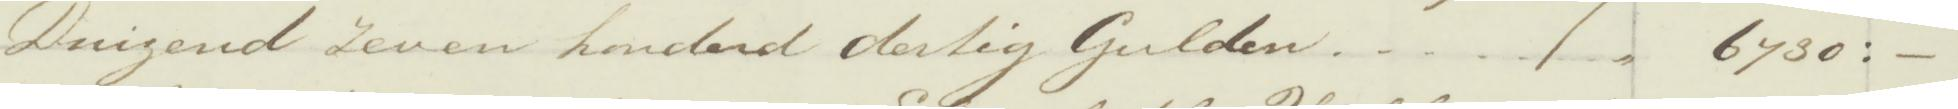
Duizend zeven honderd dertig Gulden . . . . . . „ 6730 : —
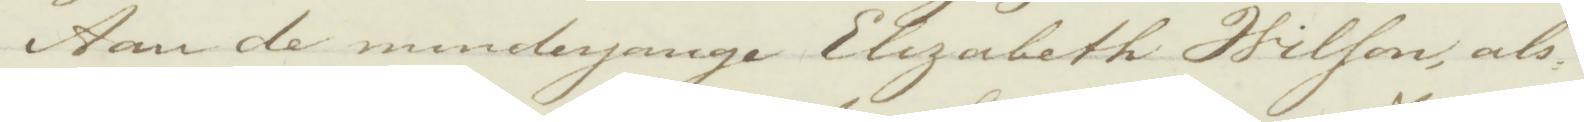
Aan de minderjarige Elizabeth Wilson, als.
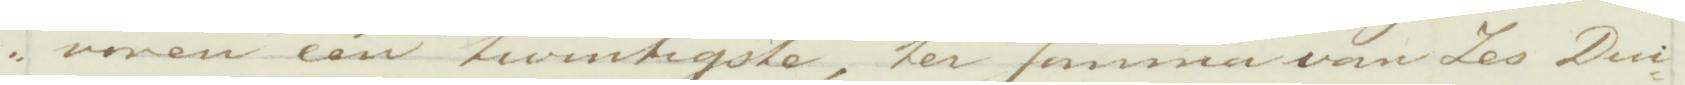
„ voren één twintigste, ter somma van Zes Dui
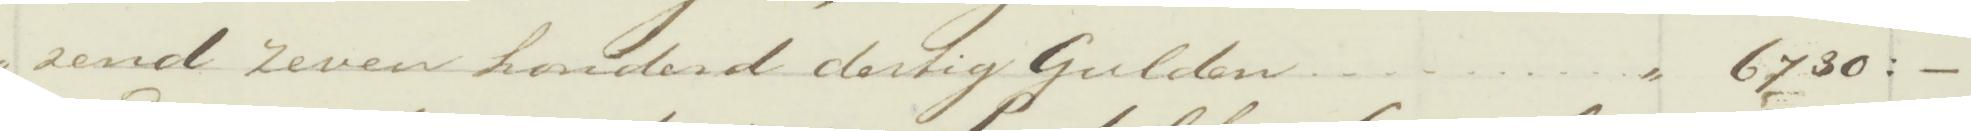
„zend zeven honderd dertig Gulden . . . . . . . . . . „ 6730 : —
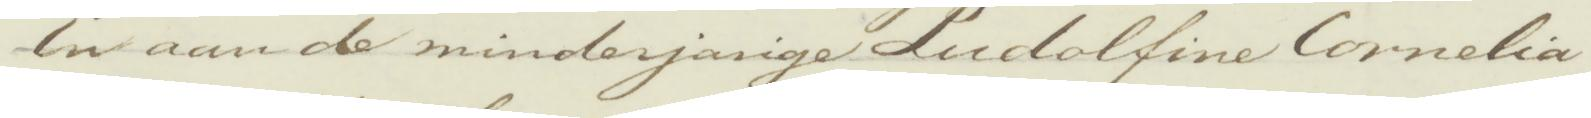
En aan de minderjarige Ludolfine Cornelia
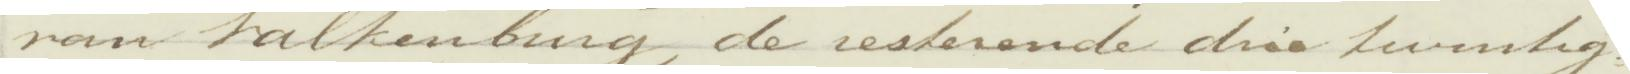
van Valkenburg, de resterende drie twintig.
